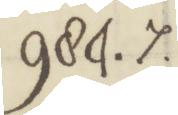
984.7.8.
